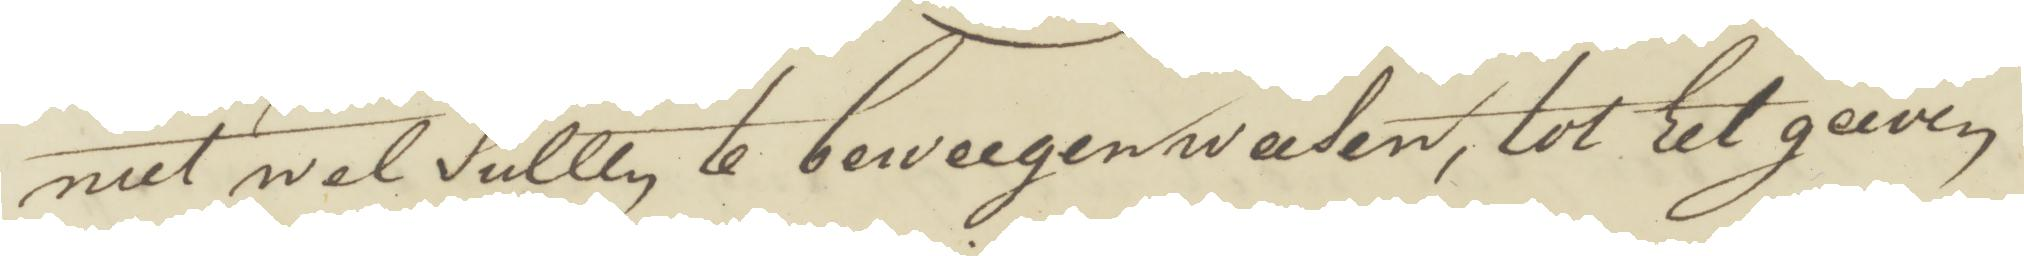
niet wel sullen te beweegen weesen, tot het geeven
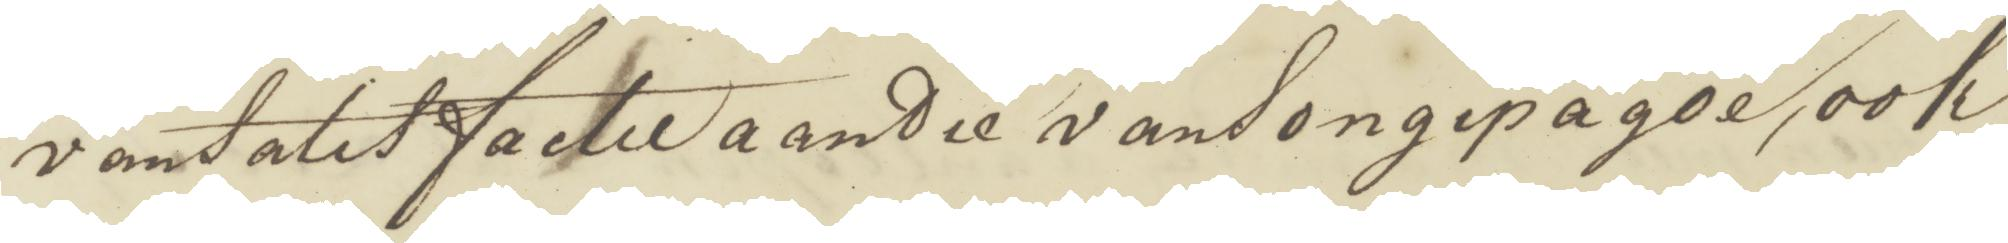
van satisfactie aan die van songipagoe, ook
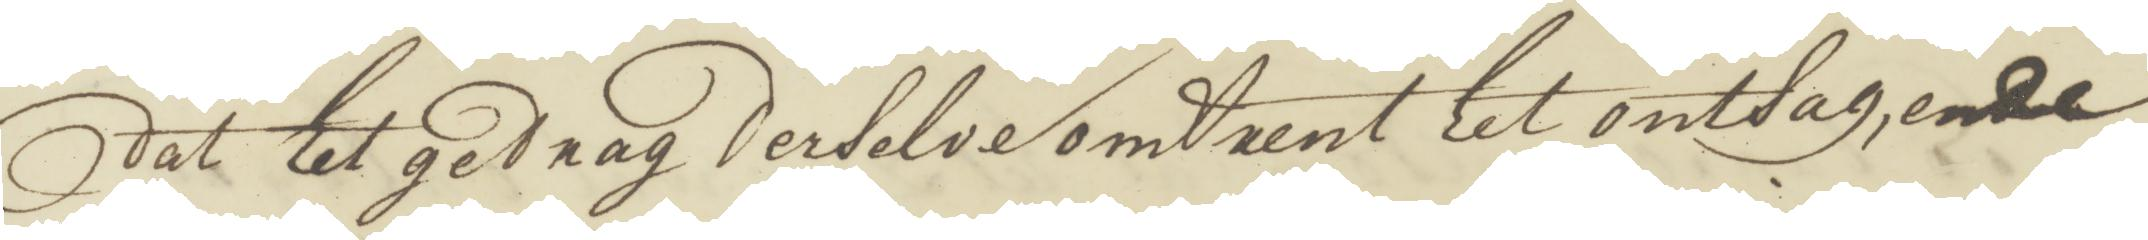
dat het gedrag derselve omtrent het ontsag, ende
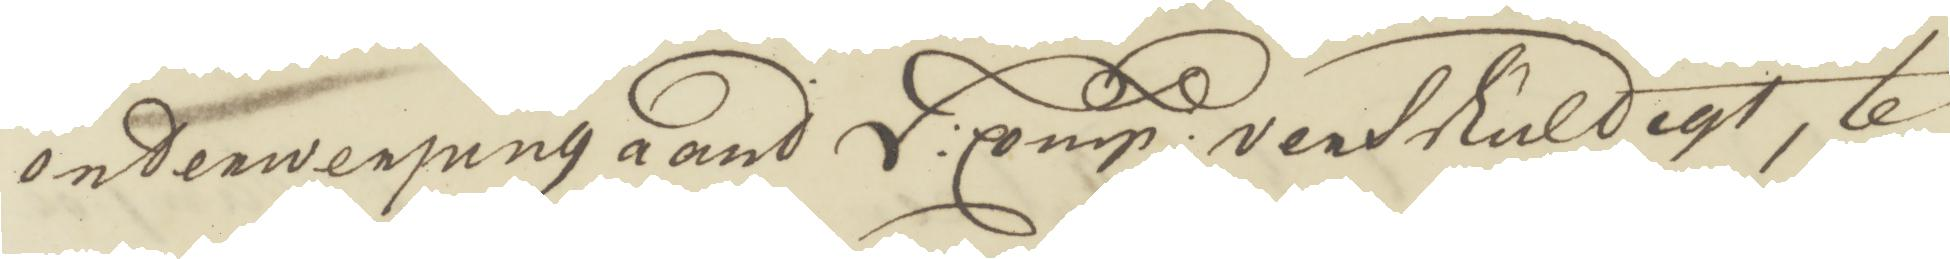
onderwerping aand E:comp: verschuldigt, te
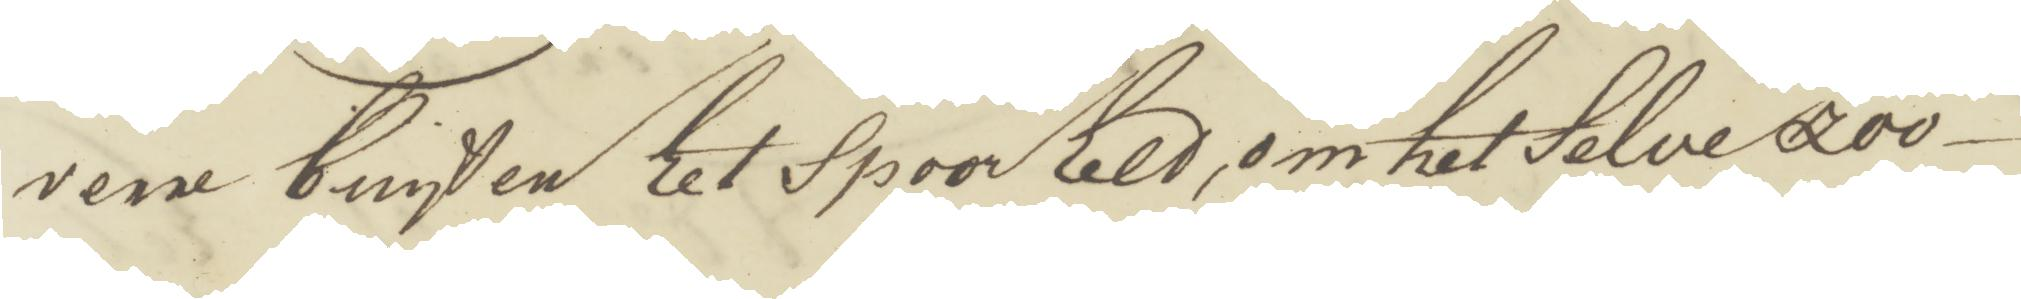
verre buijten het spoor held, om het selve zoo_
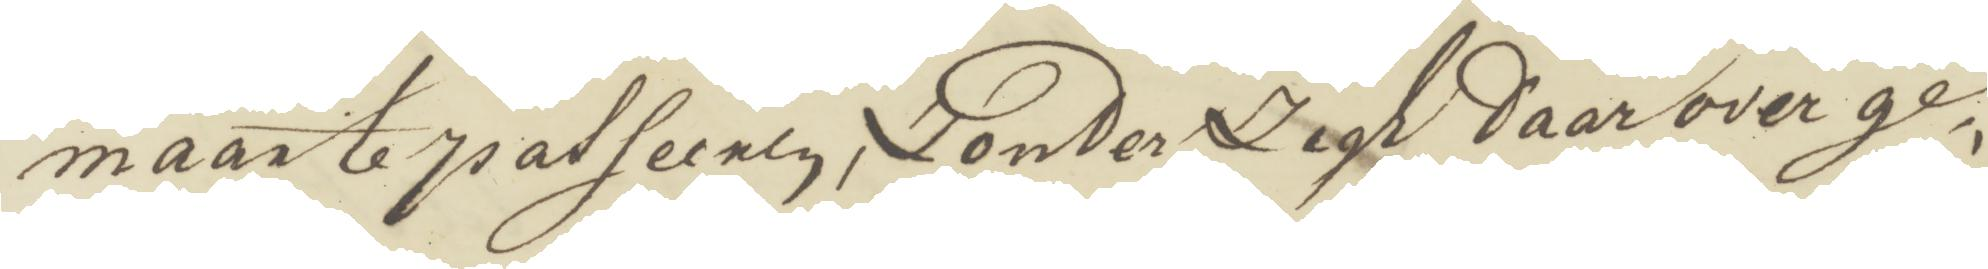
maar te passeeren, zonder zigh daar over ge„
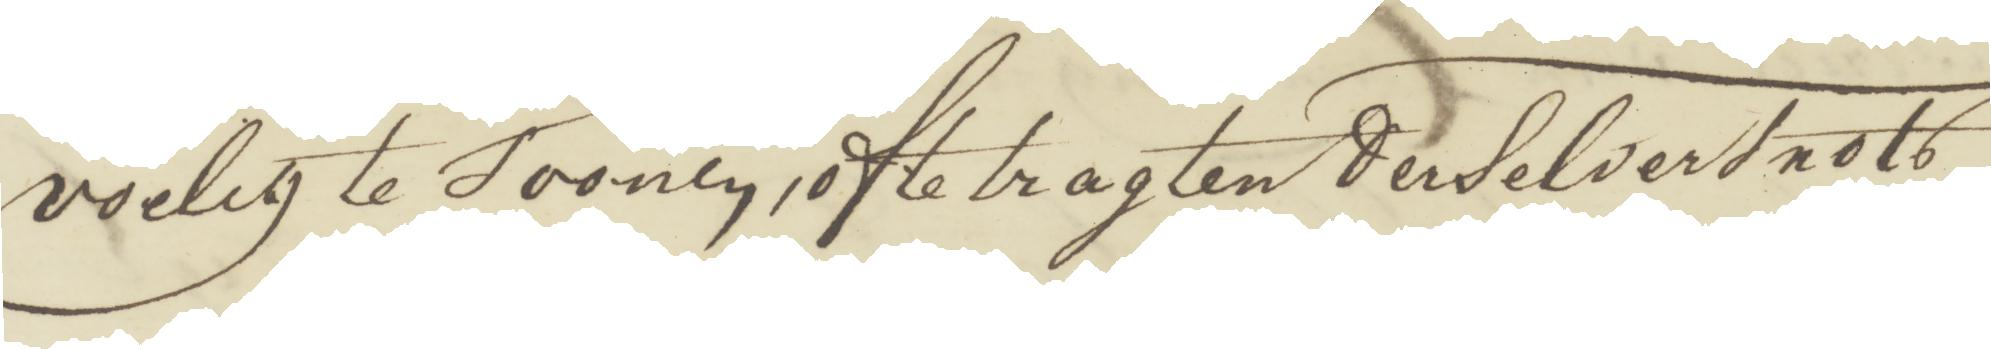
voelig te toonen, ofte tragten derselver trots
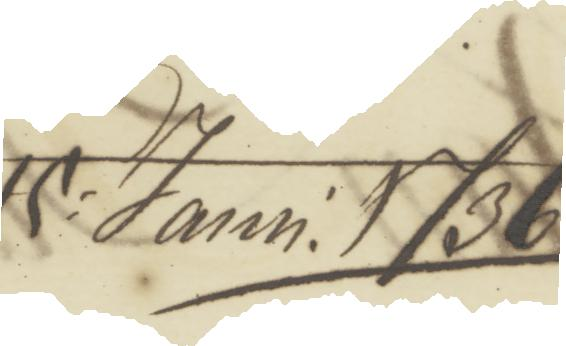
15: Jann: 1736
